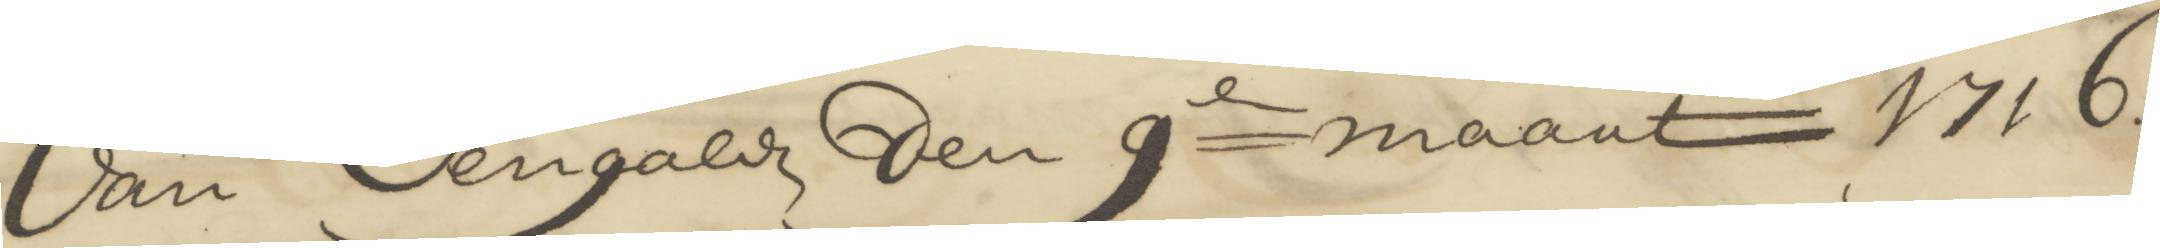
van Bengalen den 9=e maart 1716.
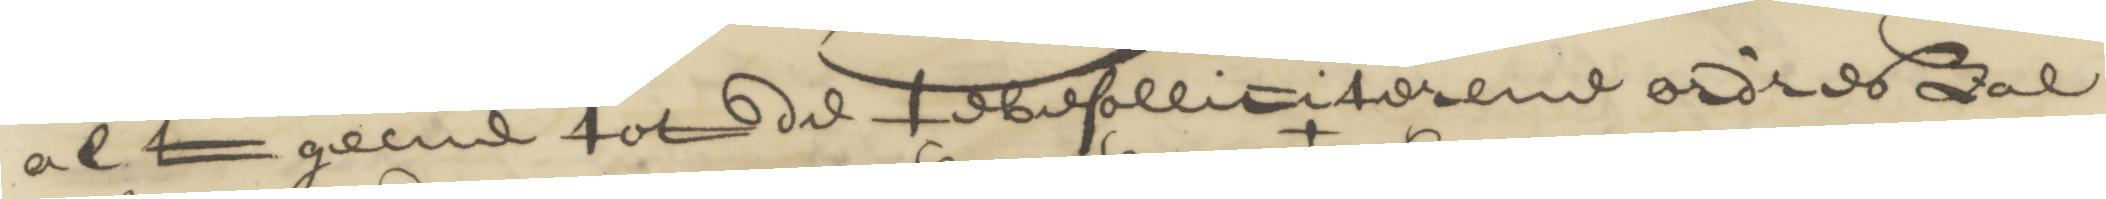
al't geene tot de te besolliciterene ord'res zal
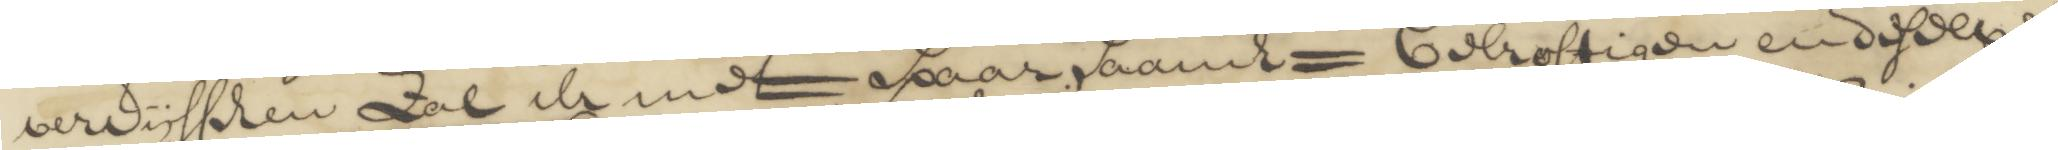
vereijsschen zal ik met spaarsaamh=t bekostigen en deselve
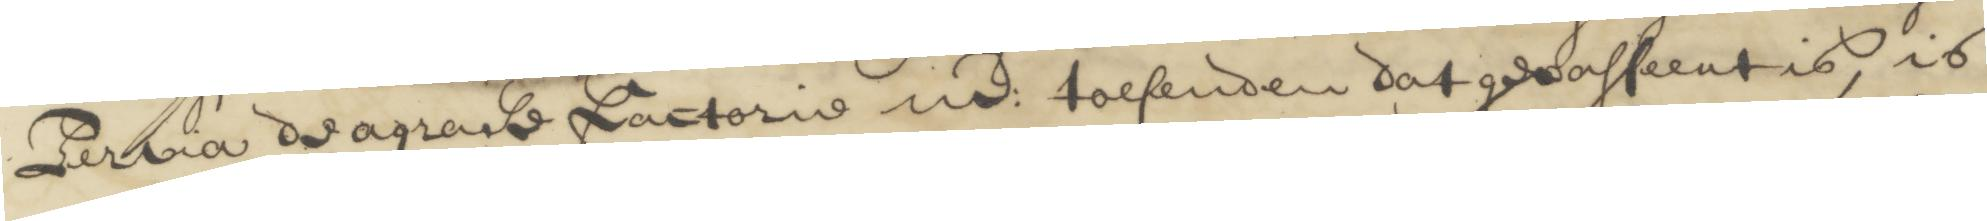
Pervia de agrase factorie uE: toesenden dat gepasseert is, is
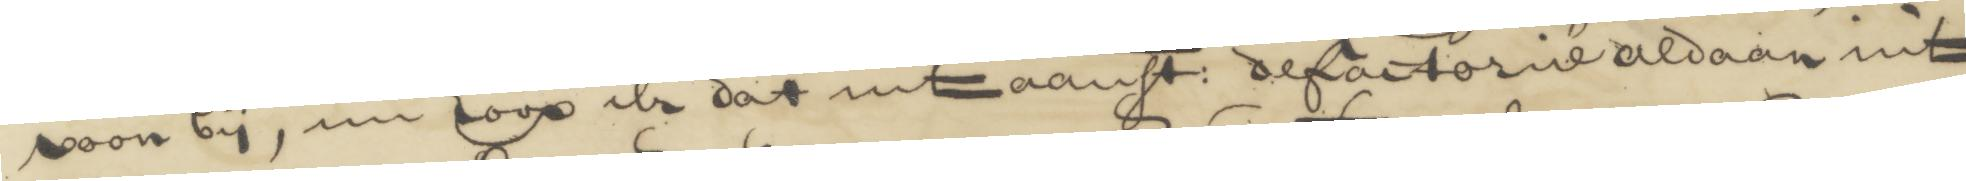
voor bij, nu hoop ik dat in't aanst: de factorie aldaar in't
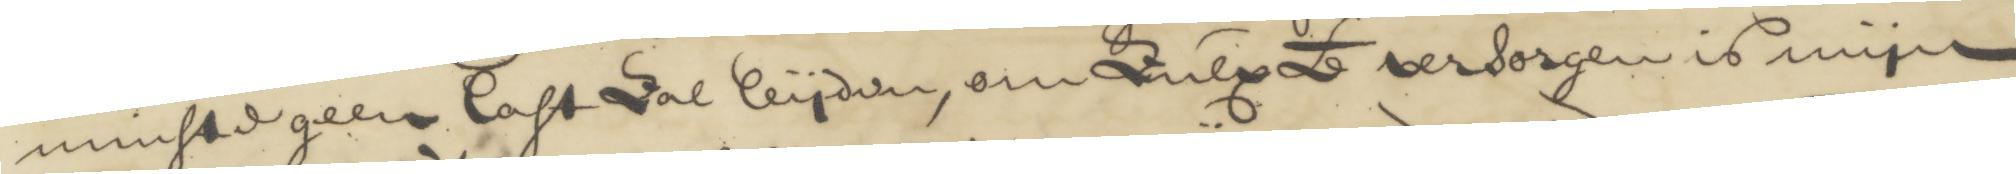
minste geen last zal leijden, om zulx te versorgen is mijn
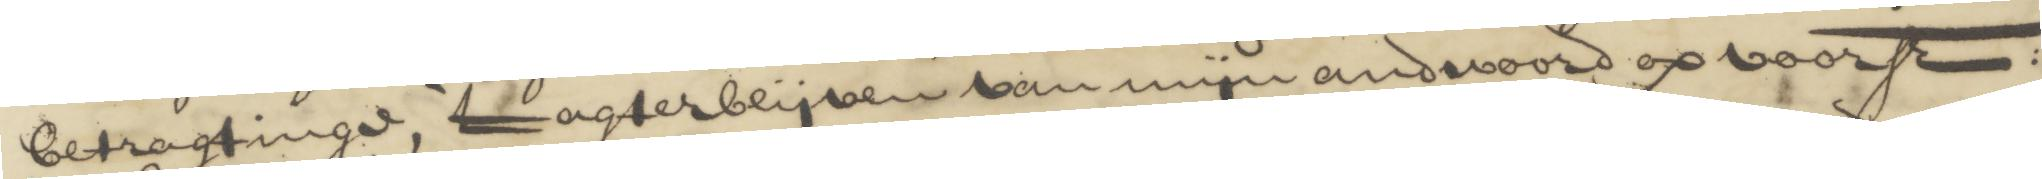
betragtinge, ’t agterblijven van mijn andwoord op voorsz:
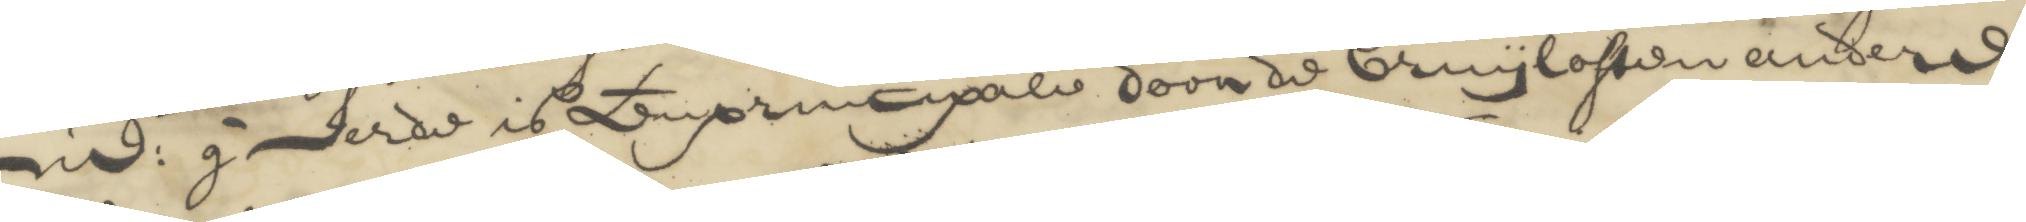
uE: g'Eerde is ten principale door de bruijloften andere
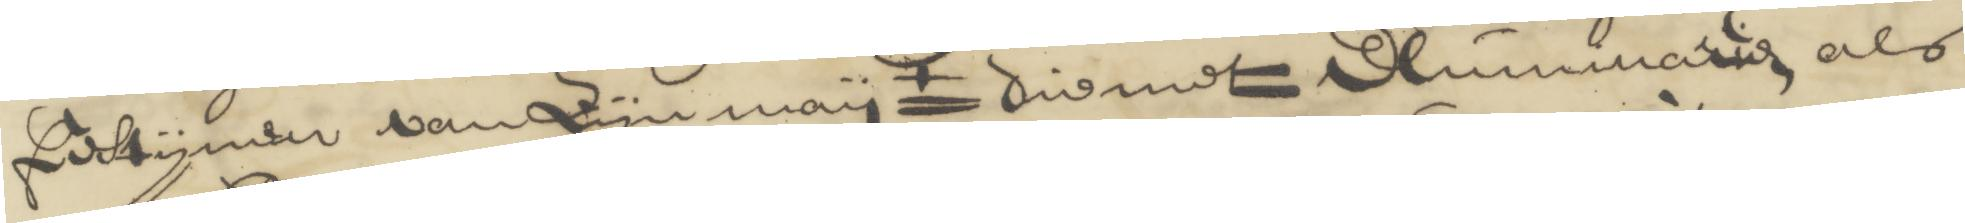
festijnen van zijn maij=t die met Elummatien als
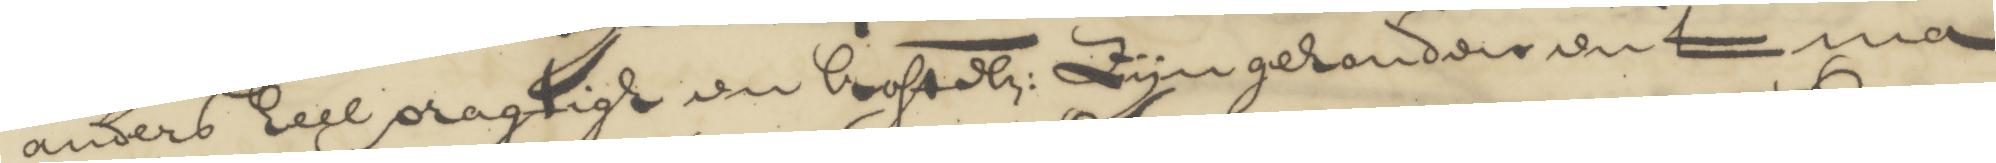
anders heel pragtigh en kostelijk zijn gehouden en't ma
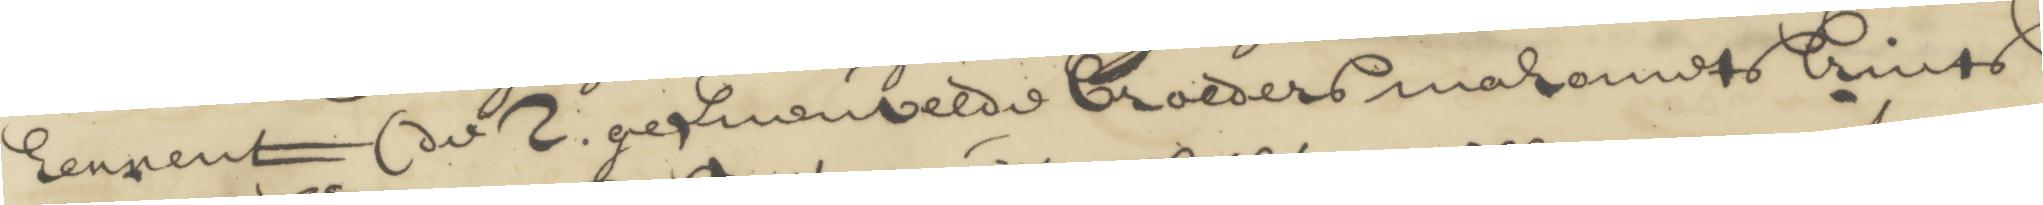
hennent (de 2. gesneuvelde broeders mahomets kints
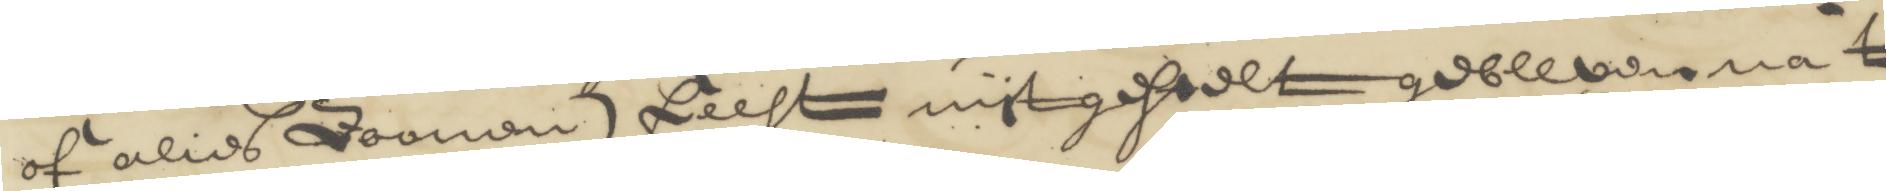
of alies zoonen) feest uijtgestelt gebleven na 't
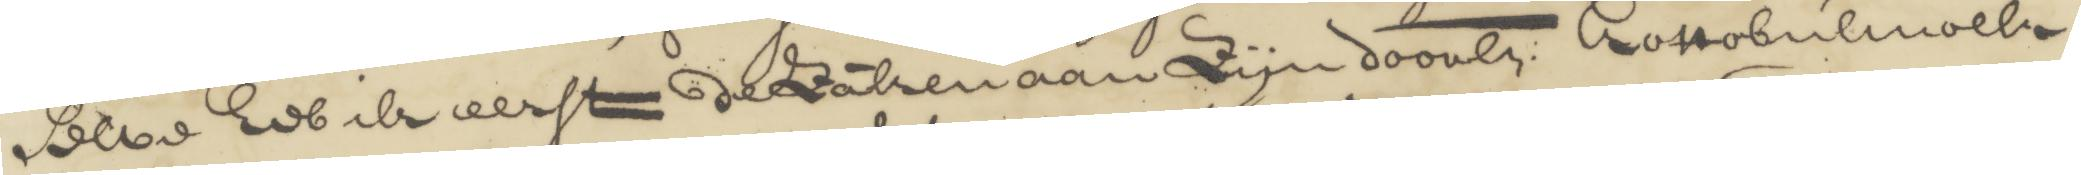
selve heb ik eerst de zaken aan zijn doorlijk kottobulmoek
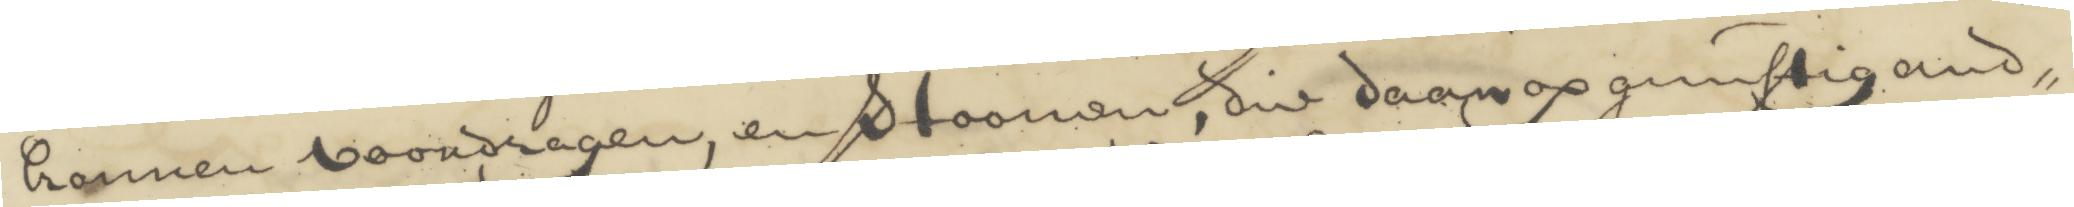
konnen voordragen, en vertoonen, die daar op gunstig and„
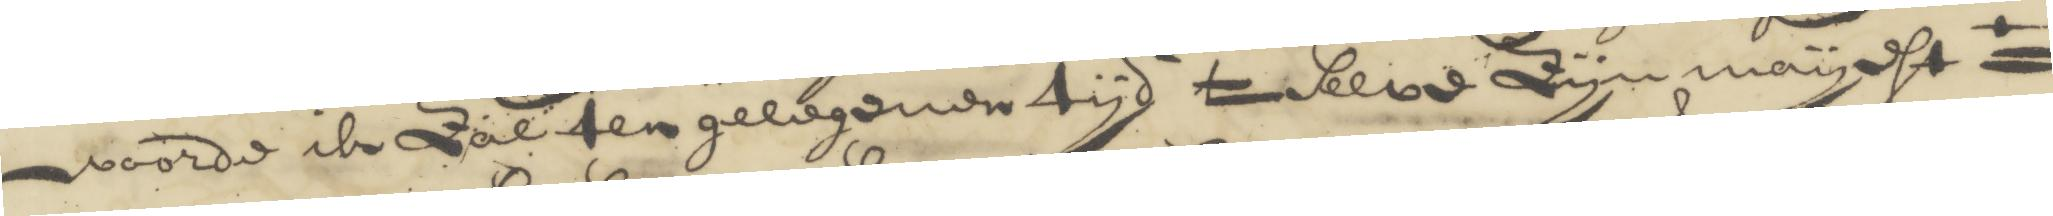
woorde ik zal ten gelegenen tijd 't selve zijn maijest=t
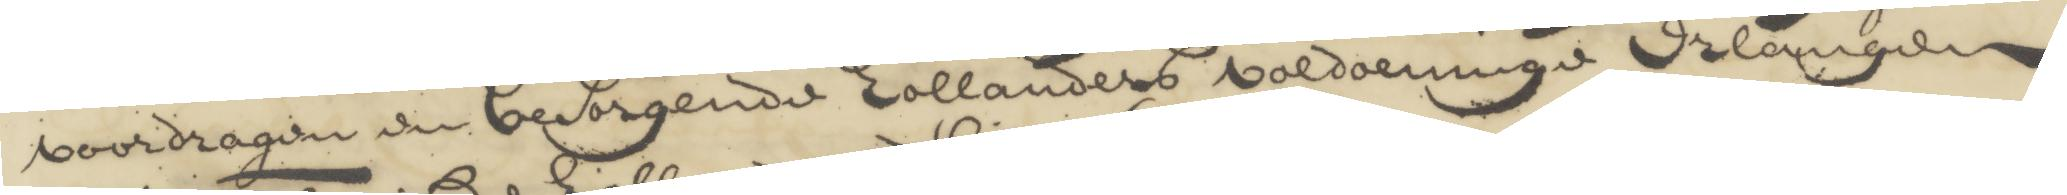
voordragen en besorgen de hollanders voldoeninge Erangen
